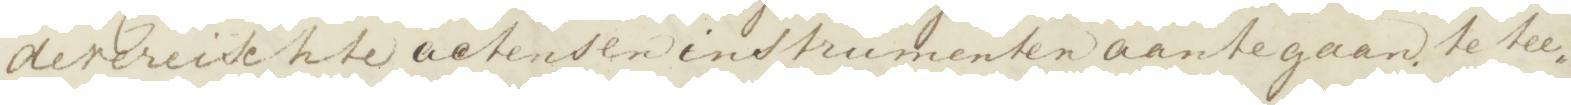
de vereischte actens en instrumenten aantegaan, te tee„
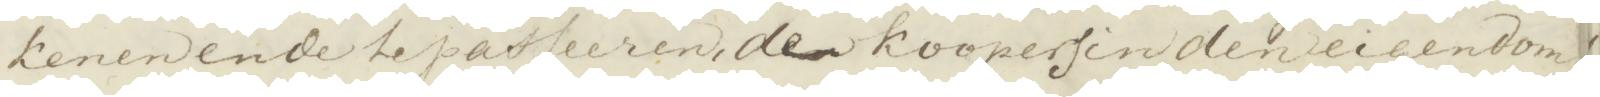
kenen ende te passeeren, den koopers in den eigendom
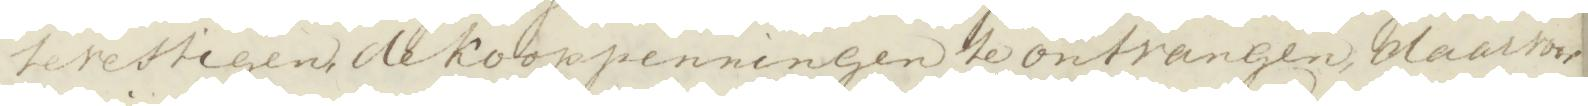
tevestigen, de kooppenningen te ontvangen, daarvoor
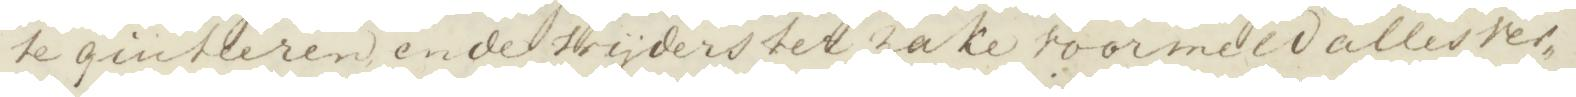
te quiteeren, ende wijders ter zake voormeld alles ver„
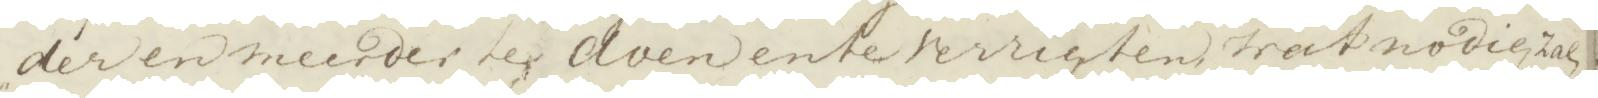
der en meerder te doen en te verrigten, wat nodig zal
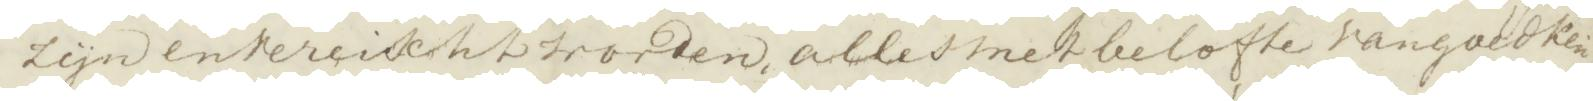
zijn en vereischt worden, alles met belofte van goedkeu
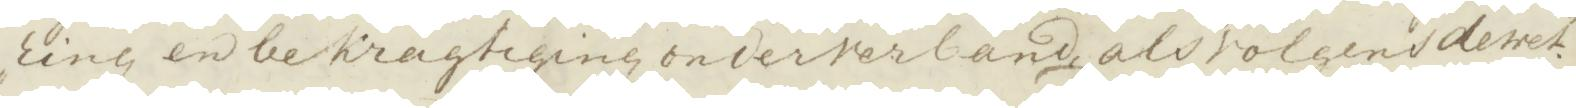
ring en bekragtiging onderverband, als volgens de wet
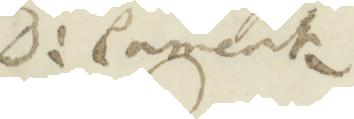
D: Lamerk
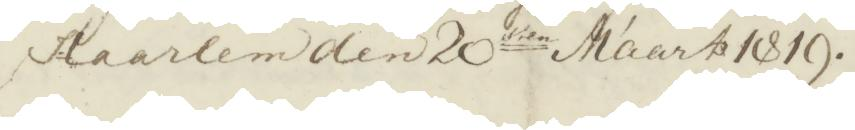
Haarlem den 20=sten Maart 1819.
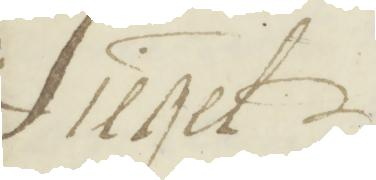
J:" T: Siegel
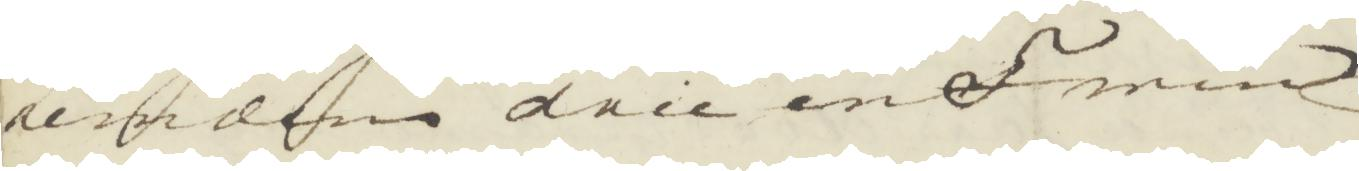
lem den drie en Twin
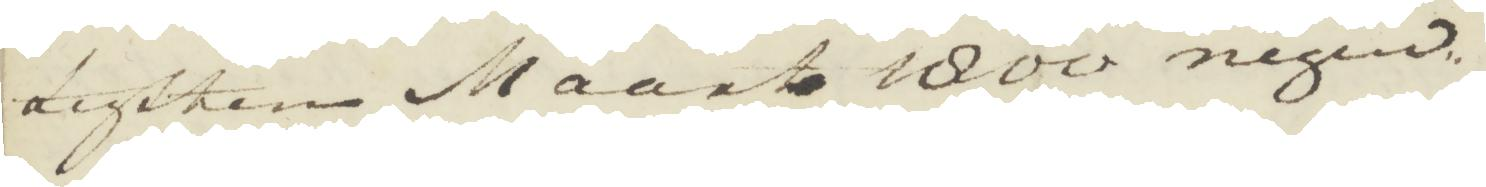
digsten Maart 1800 negen„
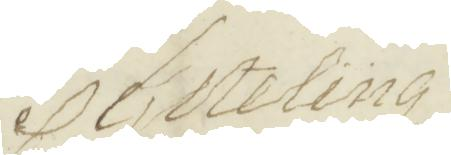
C Goteling
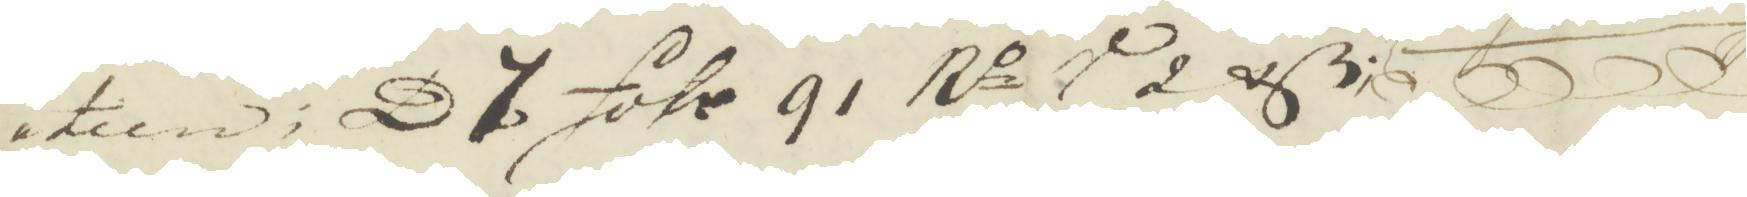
„tien; D7 fol.o 91 R=o V 2 & 3
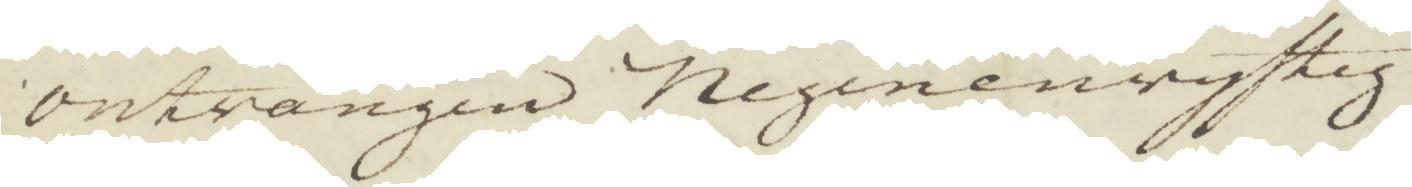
ontvangen Negenenvyftig
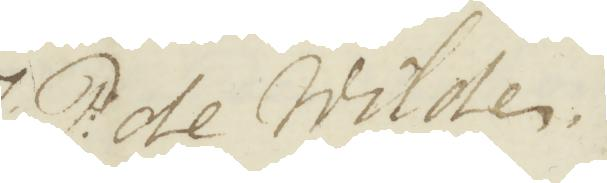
P de Wilde.
